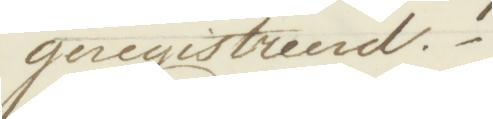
geregistreerd. -
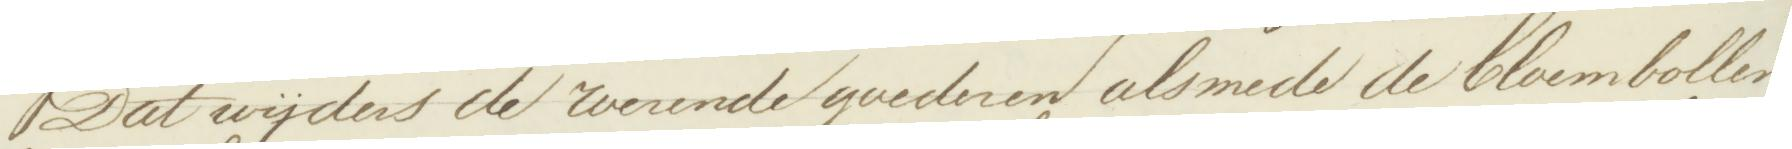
Dat wijders de roerende goederen alsmede de bloembollen
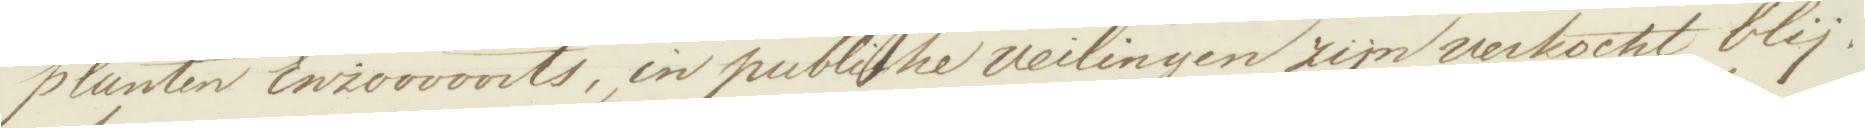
planten Enzoovoorts, in publieke veilingen zijn verkocht blij.
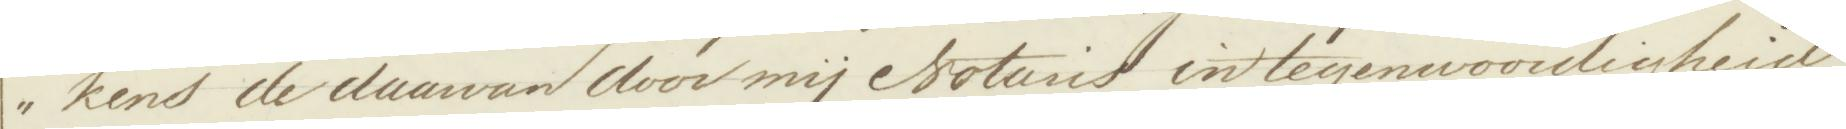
„kens de daarvan door mij Notaris in tegenwoordigheid
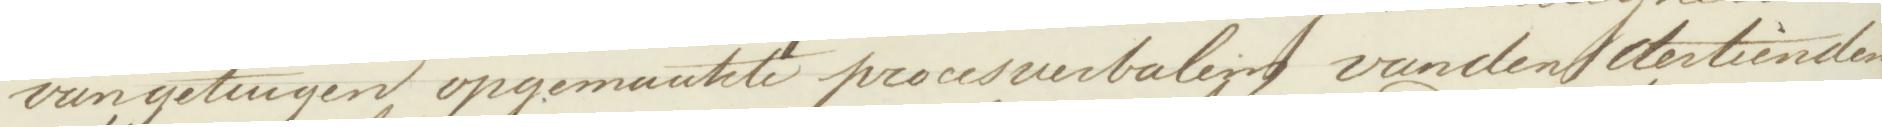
van getuigen opgemaakte proces verbalen vanden dertienden
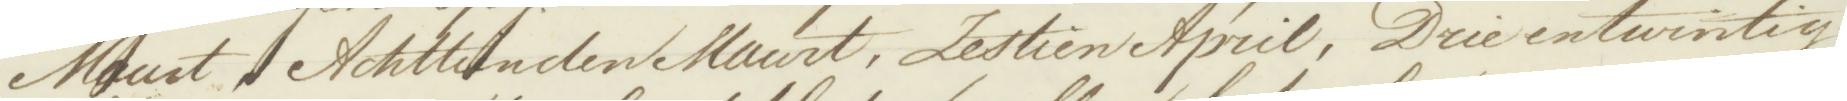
Maart Achttienden Maart, Zestien April, Drie entwintig
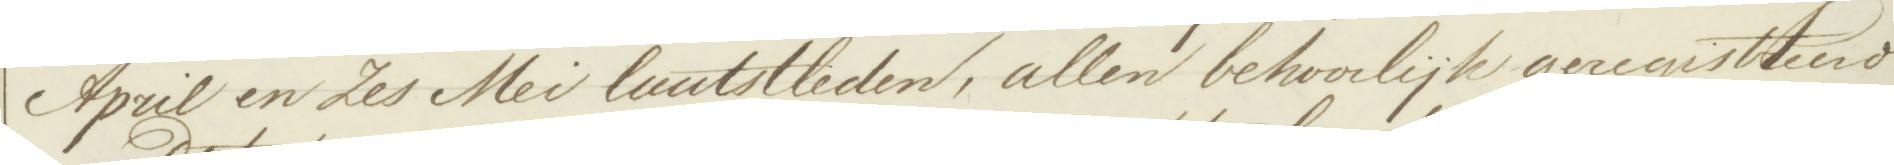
April en Zes Mei laatstleden, allen behoorlijk geregistreerd
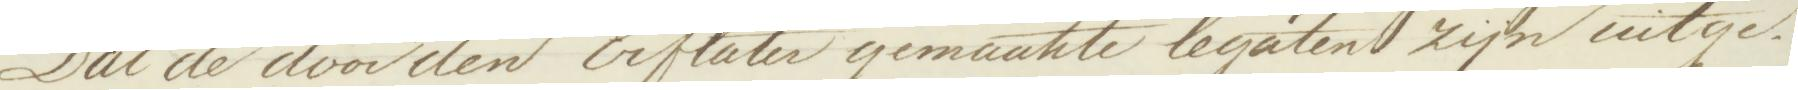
Dat de door den Erflater gemaakte legaten zijn uitge„
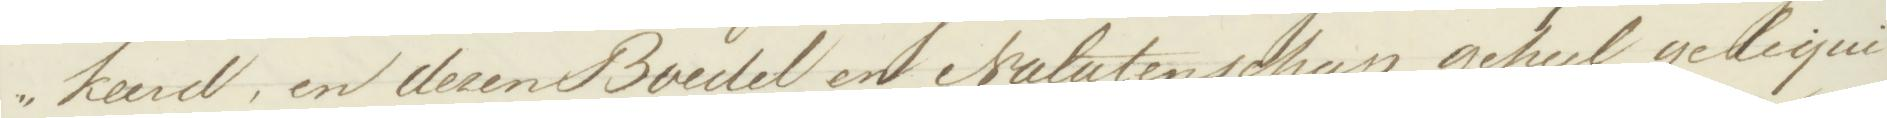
„keerd, en dezen Boedel en Nalatenschap geheel geliqui
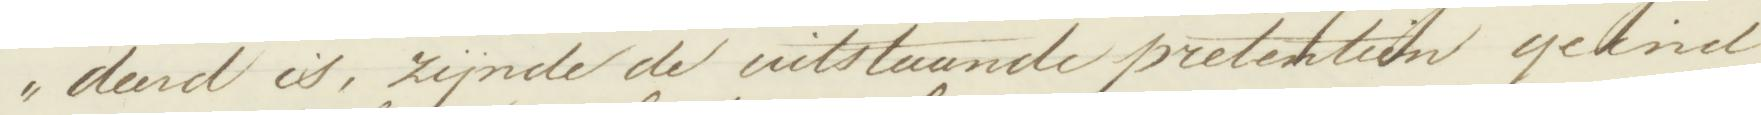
„deerd is, zijnde de uitstaande pretentien geind
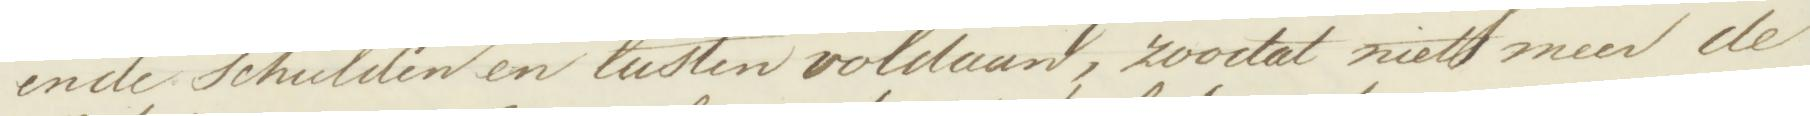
ende schulden en lasten voldaan, zoodat niets meer de
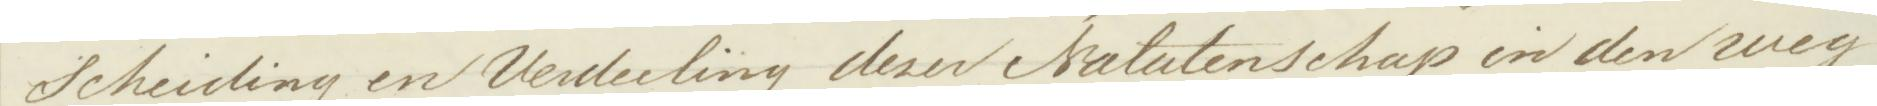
scheiding en verdeeling dezer Nalatenschap in den weg
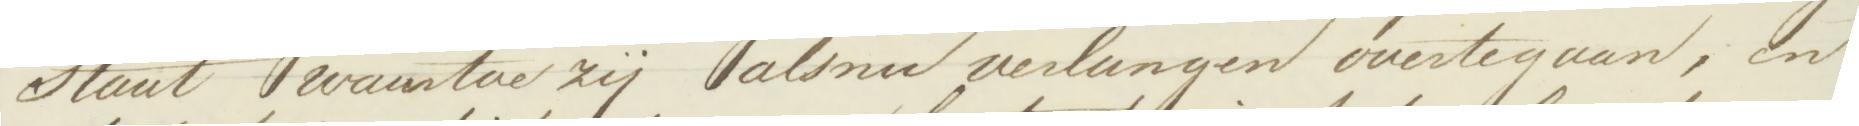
staat waartoe zij als nu verlangen overtegaan, en
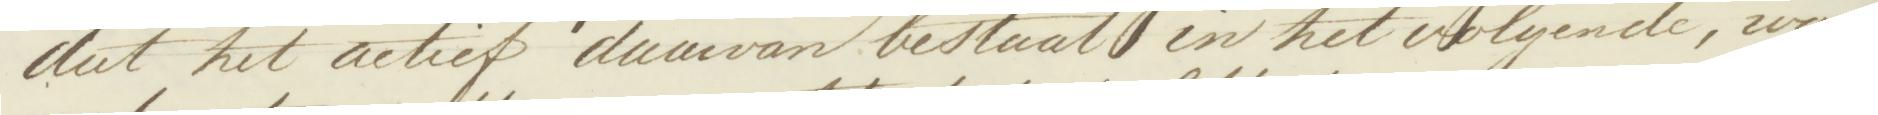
dat het actief daarvan bestaat in het volgende, waar
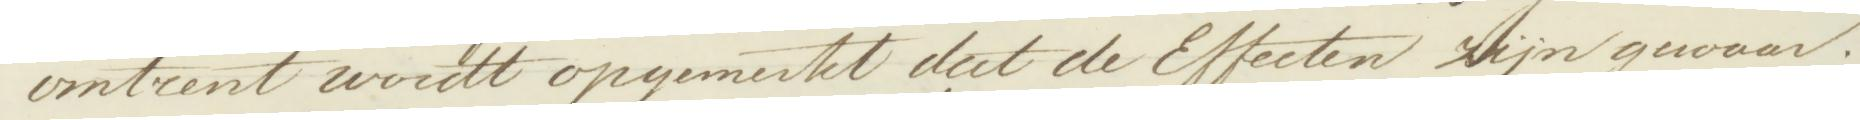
omtrent wordt opgemerkt dat de Effecten zijn gewaar.
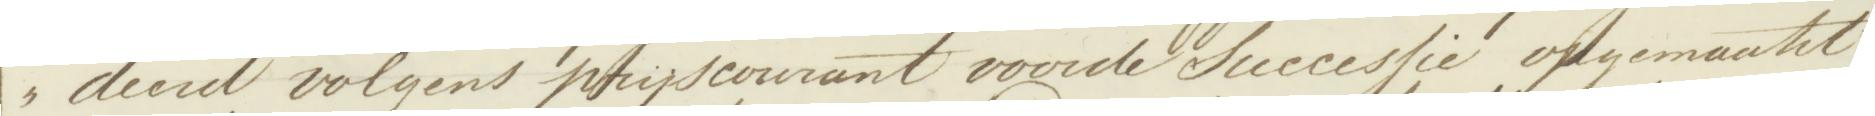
„deerd volgens prijscourant voorde Successie opgemaakt
